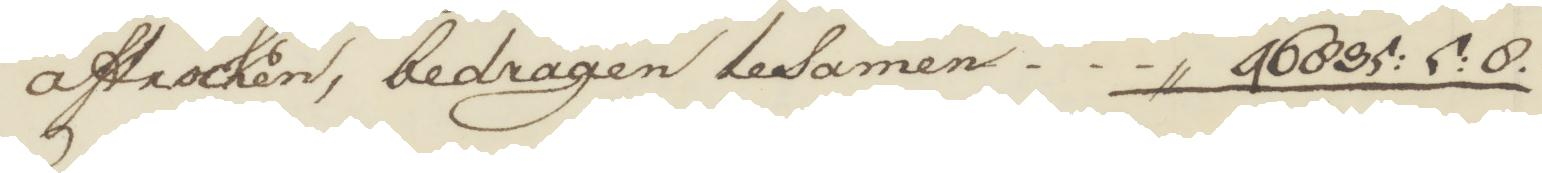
aftrocken, bedragen tesamen - - - „ 46835: 5: 8.
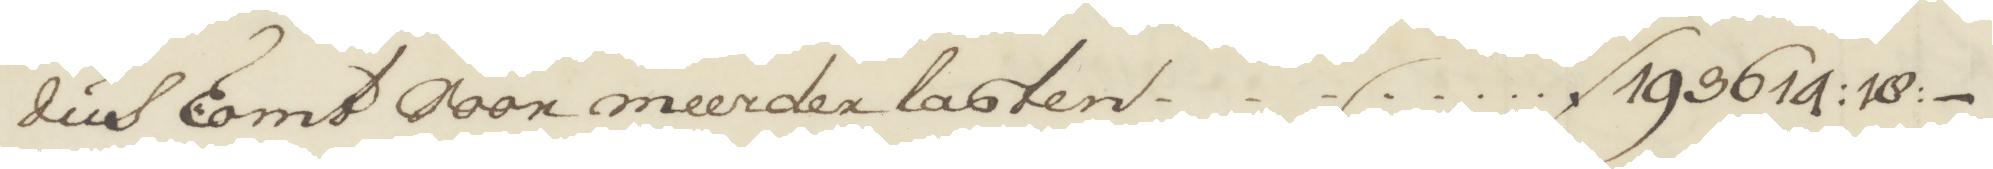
dus Comt voor meerder lasten - - - - . . . . ƒ193614:18:—
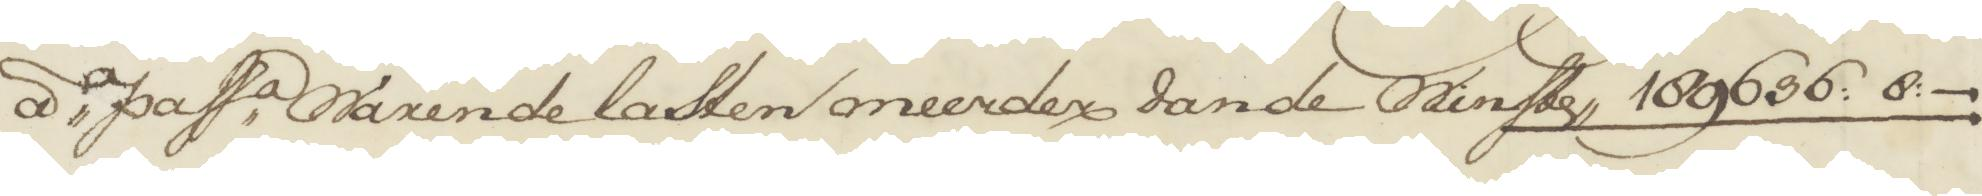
a„o pass„o waren de lasten meerder dan de winsten„ 189636: 8:—
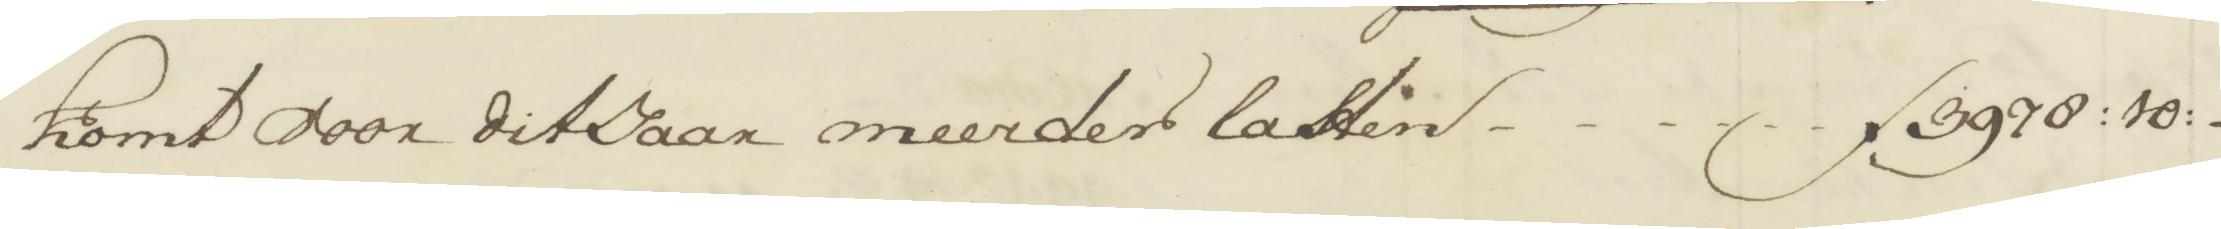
komt voor dit Iaar meerder lasten - - - - - - ƒ3978:10:
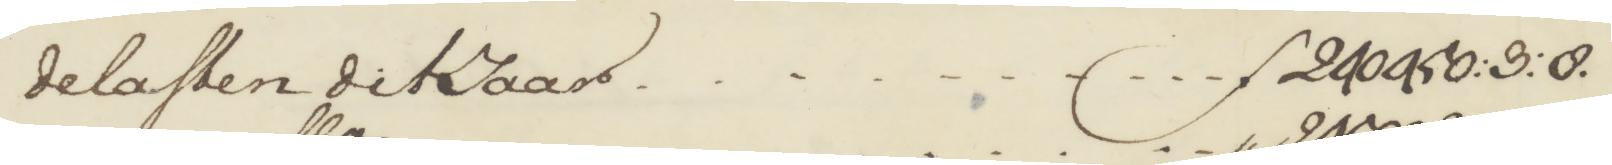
de lasten dit Iaar . . - . - - - - - - ƒ240450:3:8.
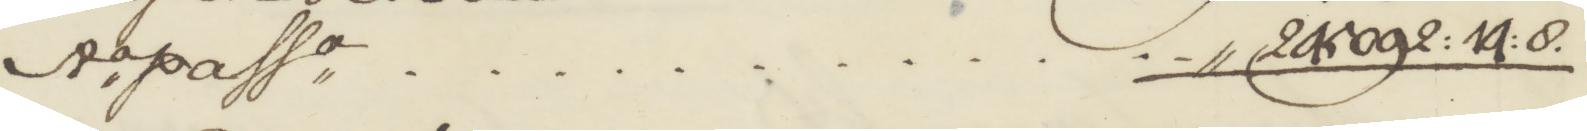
A„o pass„o . . . . . . . . . . . - „ 245092:14:8.
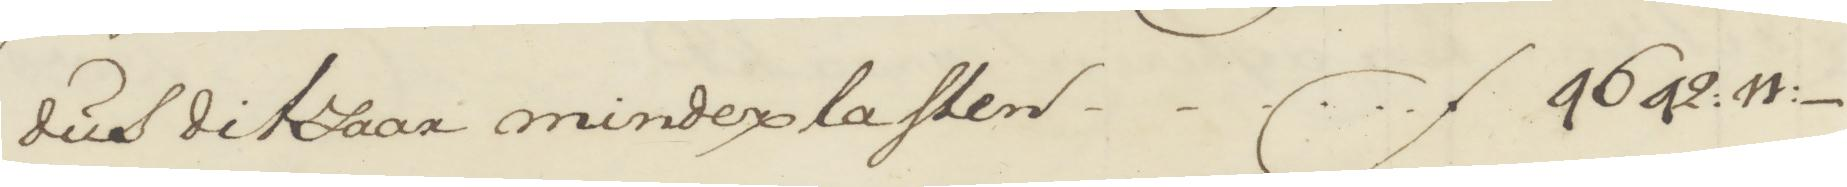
dus dit Iaar minder lasten - - - . . . ƒ 4642:11:—
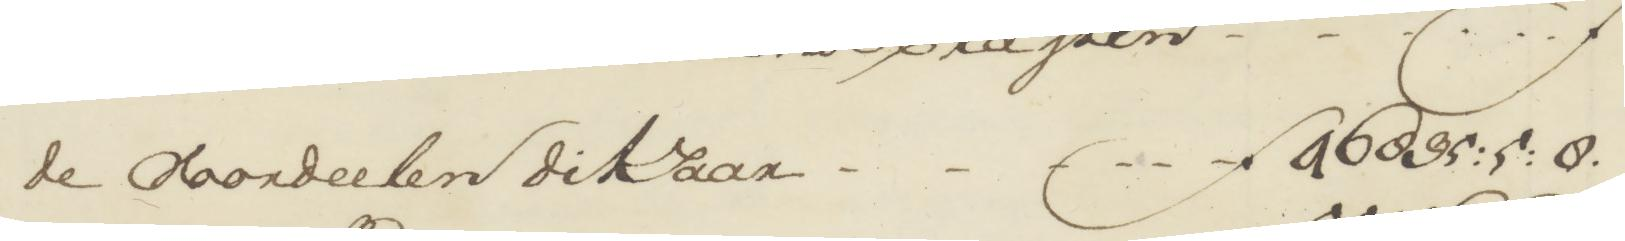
de voordeelen dit Jaar - - - - - - ƒ46835:5:8.
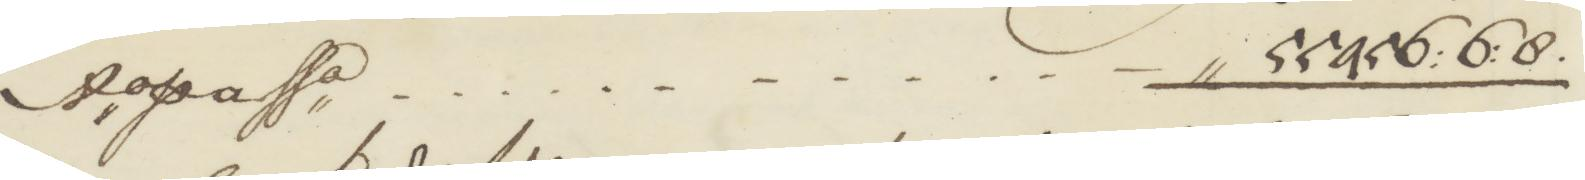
A„o pass„o - . . . . - - - - . - - „ 55456:6:8.
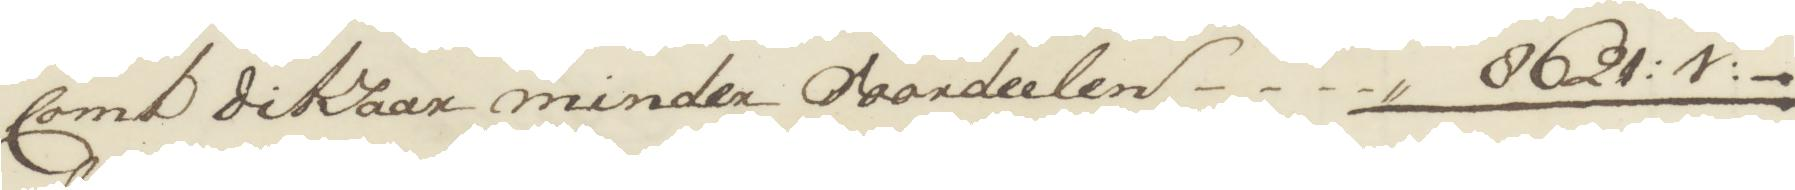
Comt dit Iaar minder voordeelen - - - - „ 8621:1:—
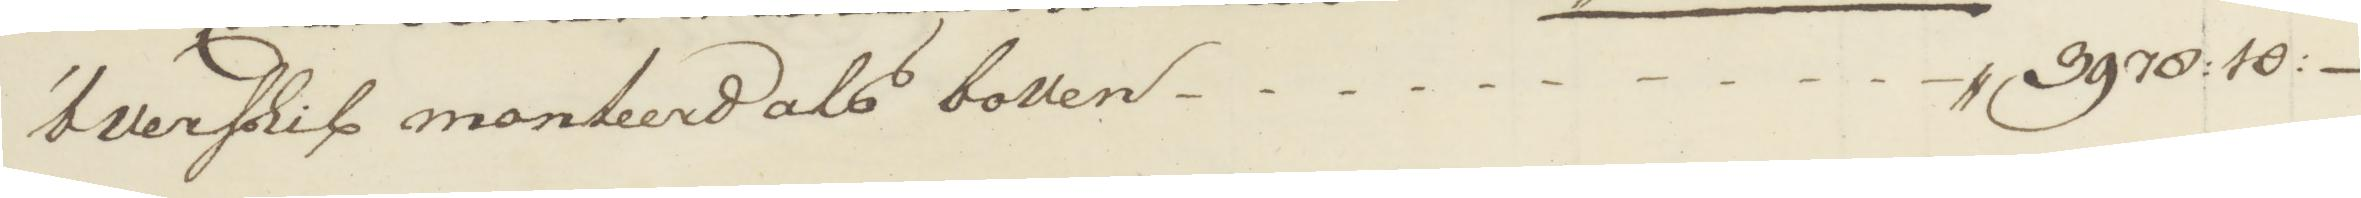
’t verschil monteerd als boven - - - - - - - - - - - „3978: 10: —
